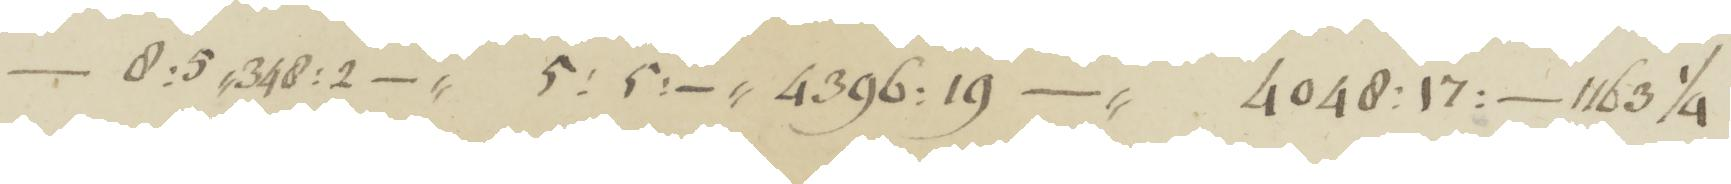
— 8:5 „348:2 —„ 5: 5:—„ 4396: 19 —„ 4048:17: —1163 ¼
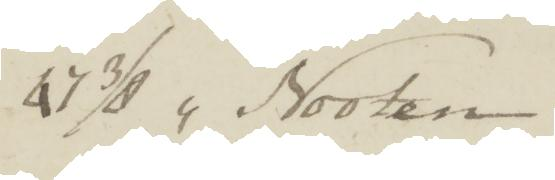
41 3/8 „ Nooten
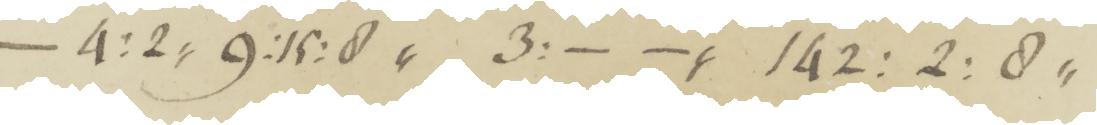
—4:2„ 9:15:8 „ 3: — —„ 142: 2: 8 „
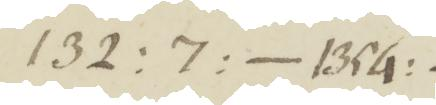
132:7: — 1354:
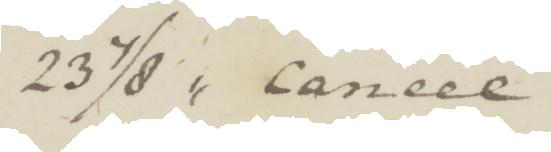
23 7/8 „ caneel
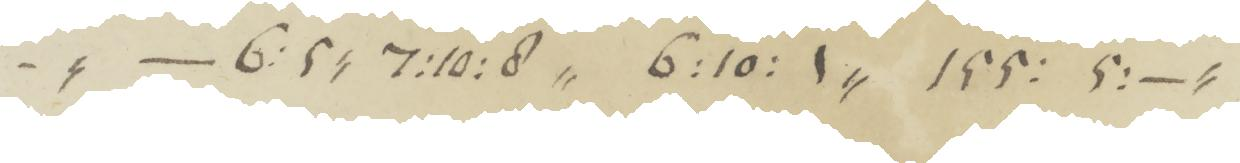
- „ — 6: 5„ 7:10: 8 „ 6:10:1 „ 155: 5:—„
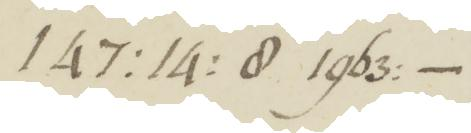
147:14: 8. 1963:—
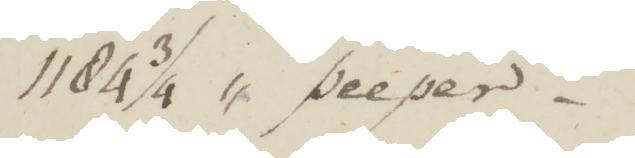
1184¾ „ peeper -
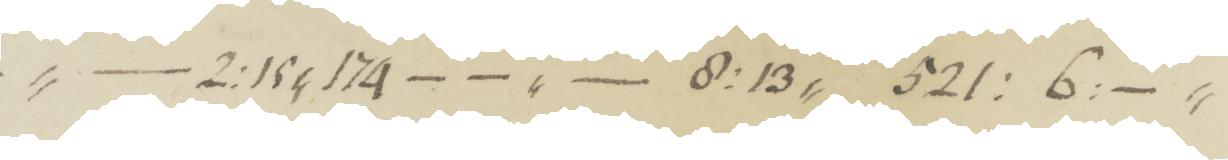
„ — 2:15„ 174 — — „ — 8: 13„ 521: 6:— „
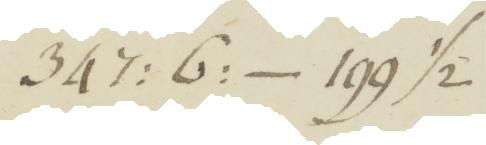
347: 6: — 199½
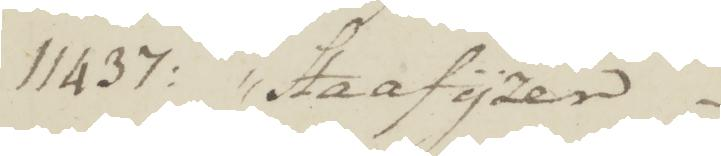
11437: „ staafijzer
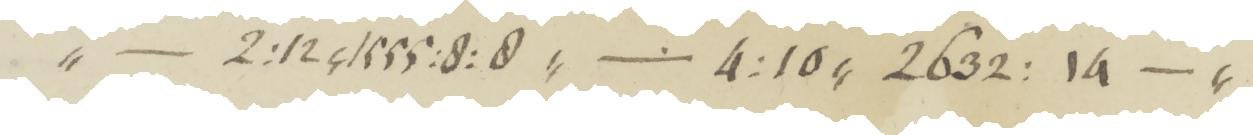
„ — 2:12„1555:8:8 „ — 4: 16„ 2632: 14 — „
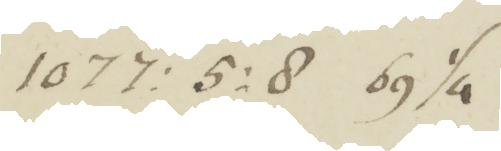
1077: 5: 8 69¼
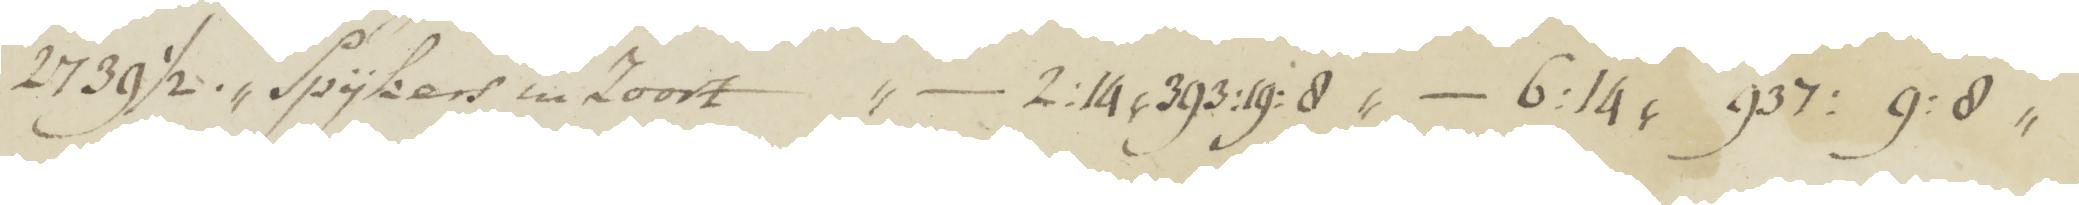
2739½. „ spijkers in zoort „ — 2: 14 „393:19:8 „ — 6:14 „ 937: 9:8 „
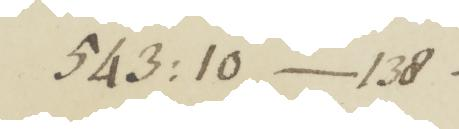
543:10 — 138.
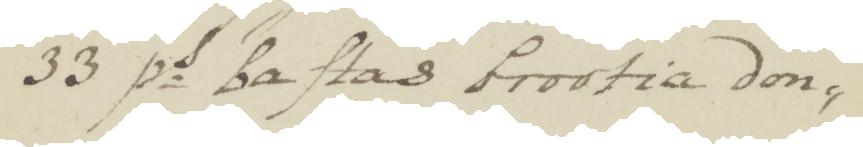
33 p=s bastas frootia don„
